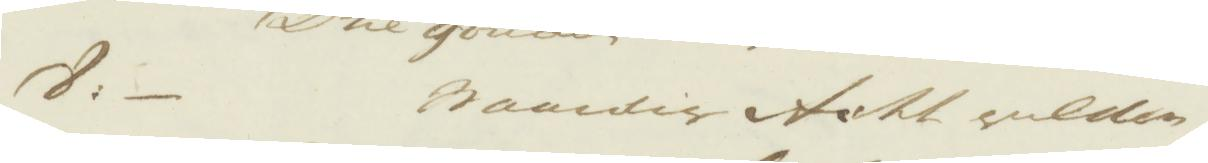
8: — waardig Acht gulden
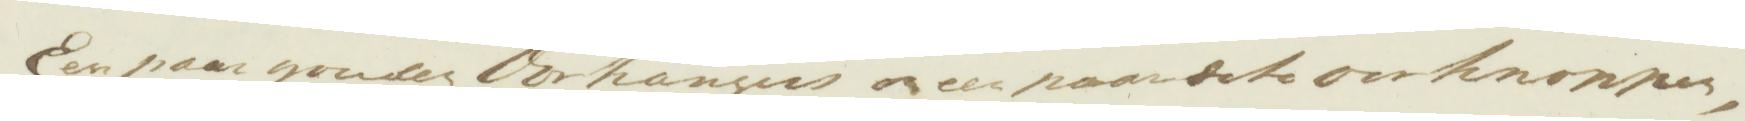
Een paar gouden Oorhangers en een paar dito oorknoppen,
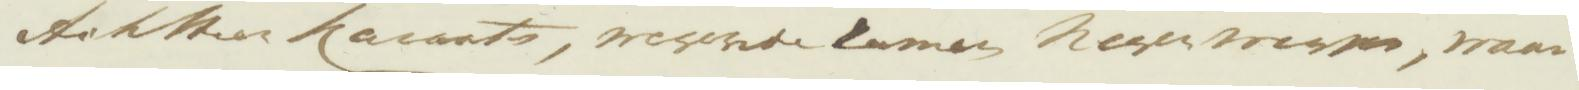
Achttien Karaats, wegende zamen negen wigjes, waar
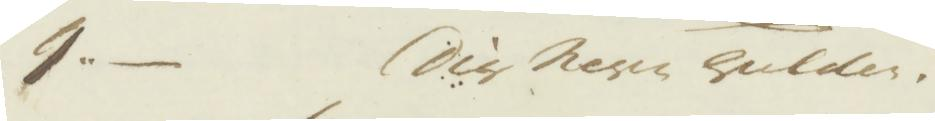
9„ — dig negen gulden.
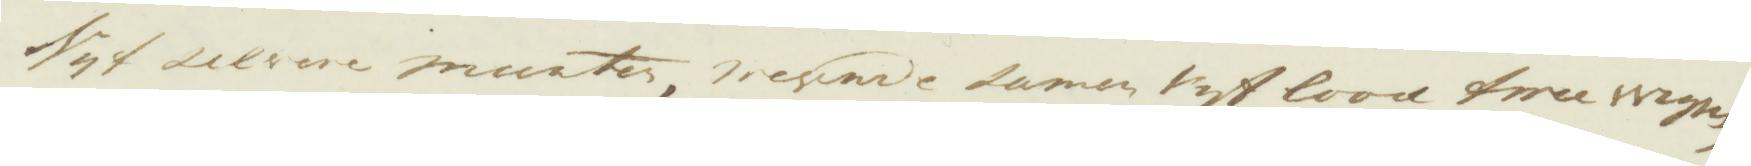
Vyf zilvere munten, wegende zamen vyf lood twee wigjes,
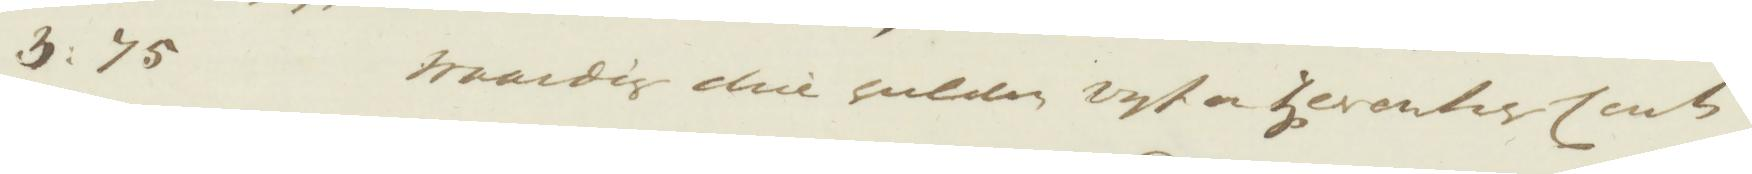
3: 75 waardig drie gulden vyf en zeventig Cents
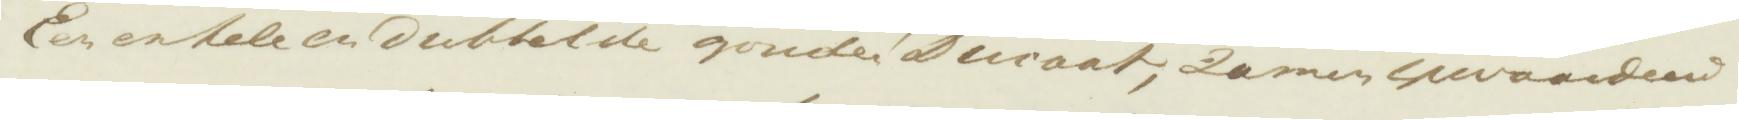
Een enkele en dubbelde goude Ducaat, zamen gewaardeerd
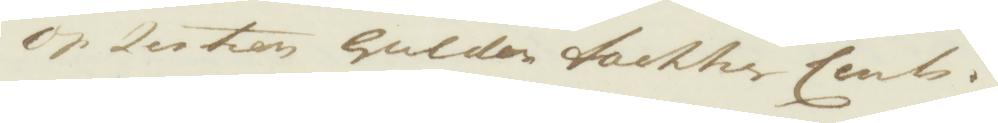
op zestien Gulden tachtig Cents.
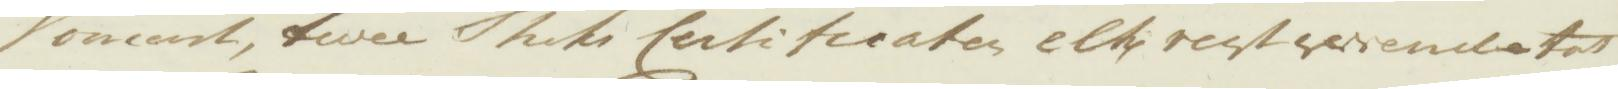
Vooreerst, twee stuks Certificaten elk regt gevende tot
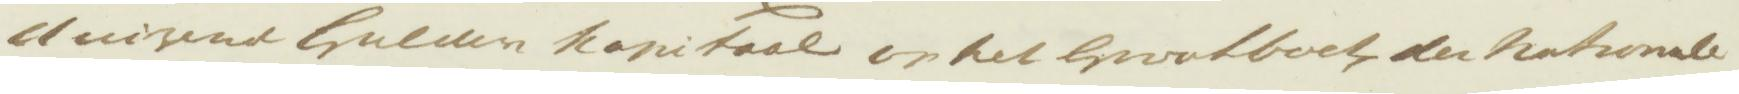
duizend Gulden kapitaal op het Grootboek der nationale
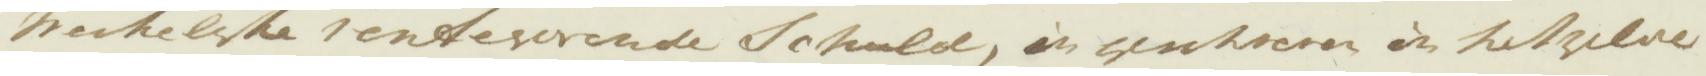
werkelyke rentegevende schuld, in geschreven in hetzelve
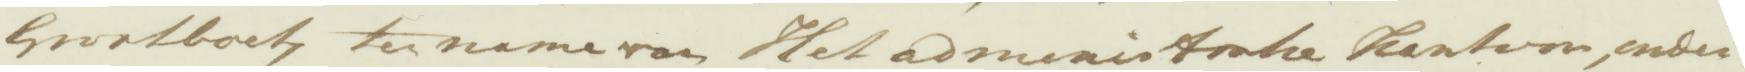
Grootboek ten name van Het administratie kantoor, onder
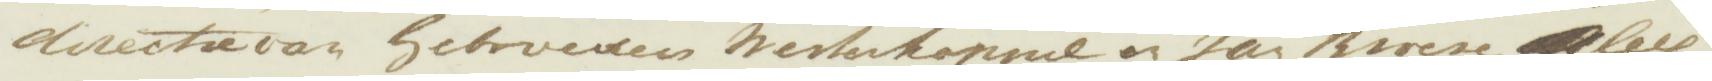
directie van Gebroeders Westerkappel en Jan Broese Alex
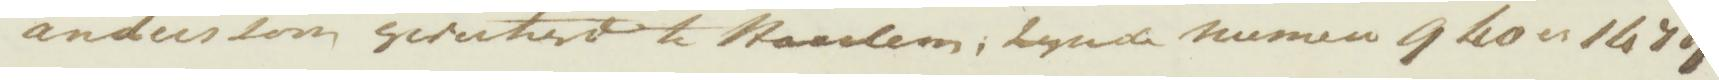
anders zoon gevestigd te Haarlem; zynde numero 940 en 1479
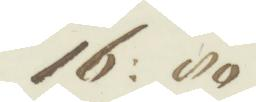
16: 80
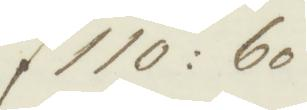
ƒ110: 60
